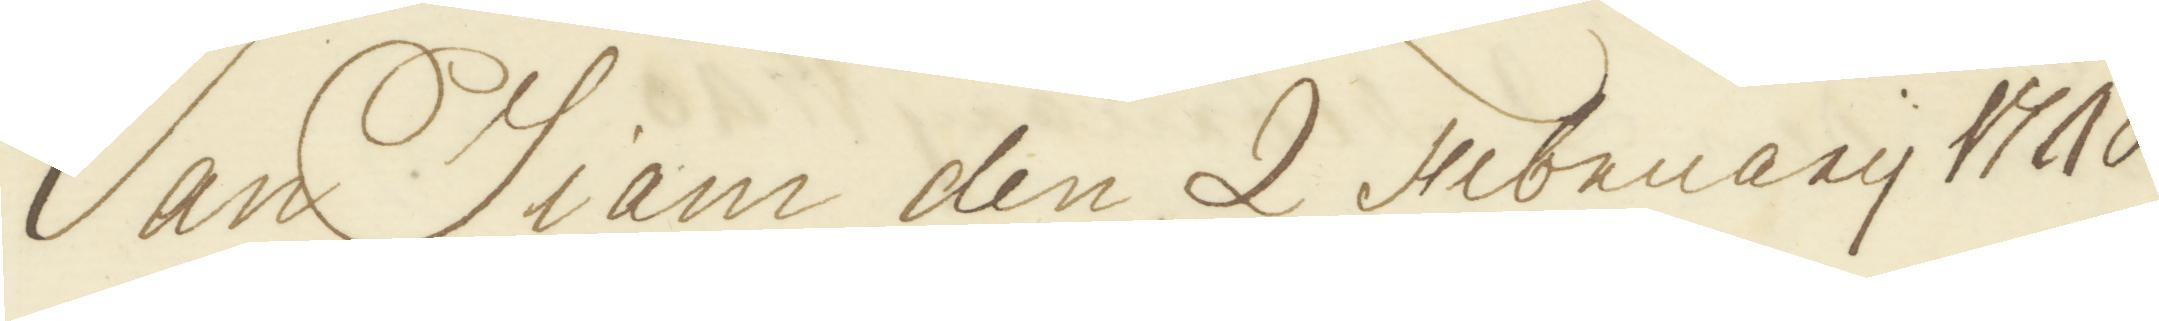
Van Siam den 2 Februarij 1740
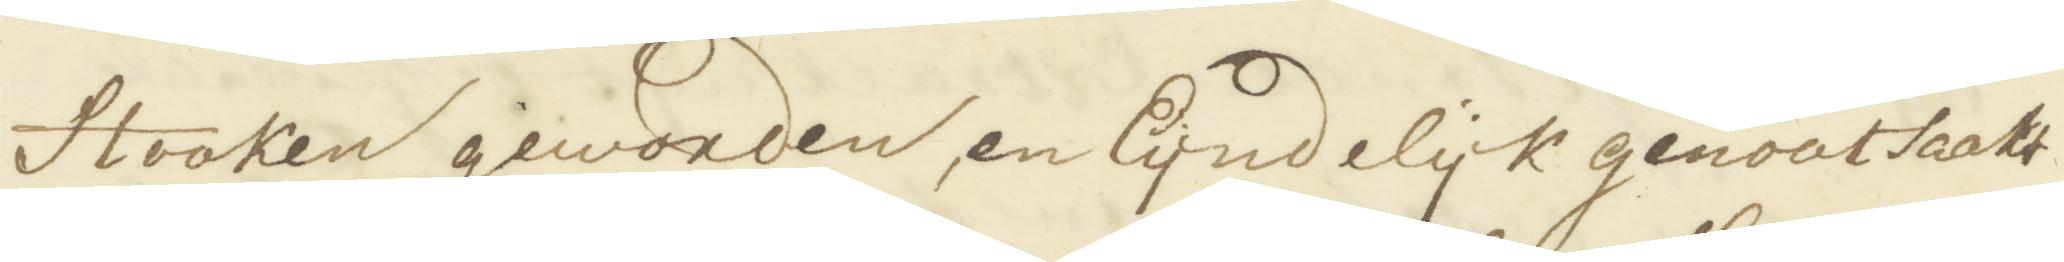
stooken geworden, en Eijndelijk genootsaakt
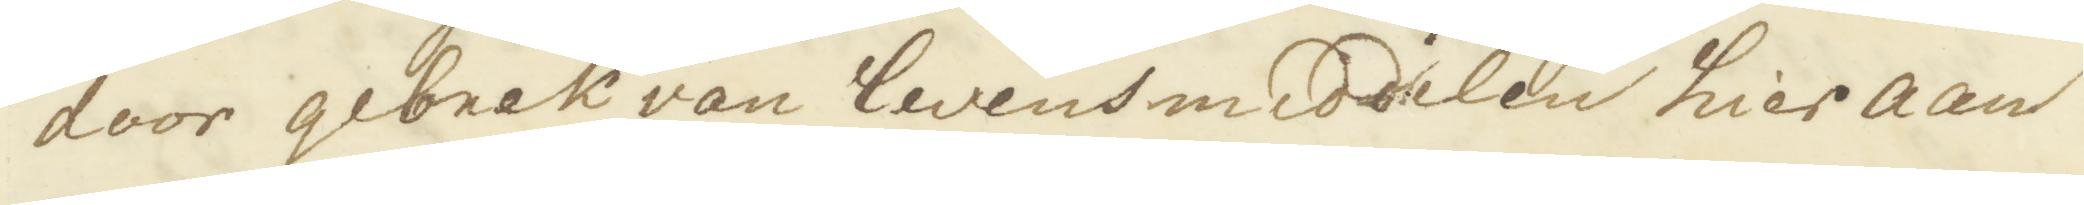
door gebrek van levensmiddelen hier aan
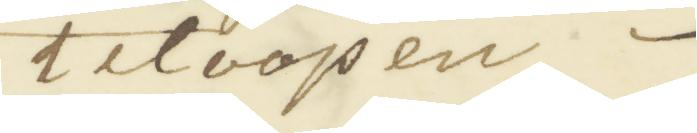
teloopen
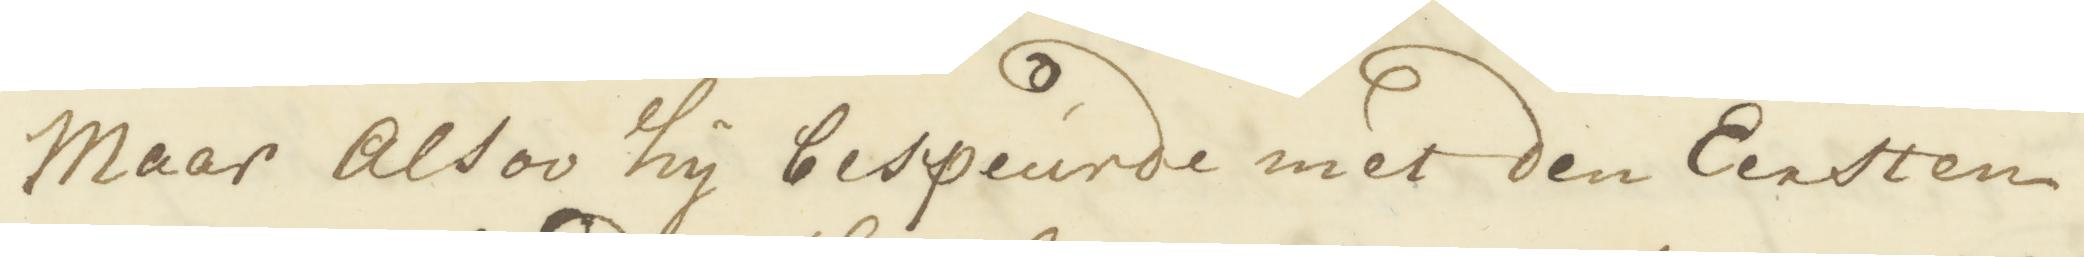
Maar alsoo hij bespeurde met den Eersten
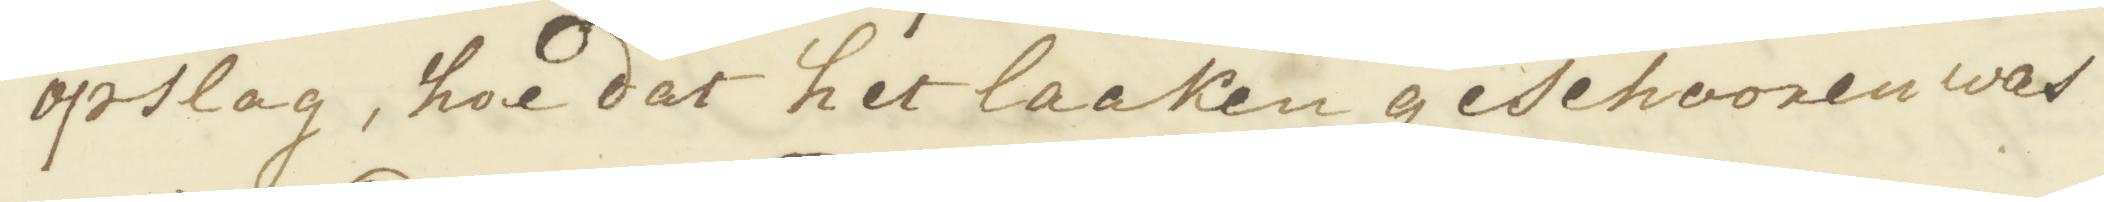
opslag, hoe dat het laaken geschooren was
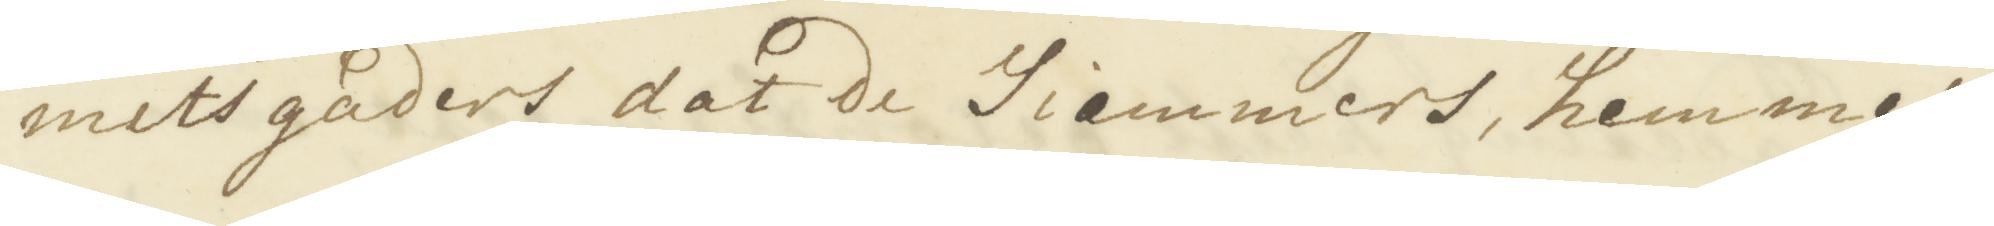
mitsgaders dat de Siammers, hem met
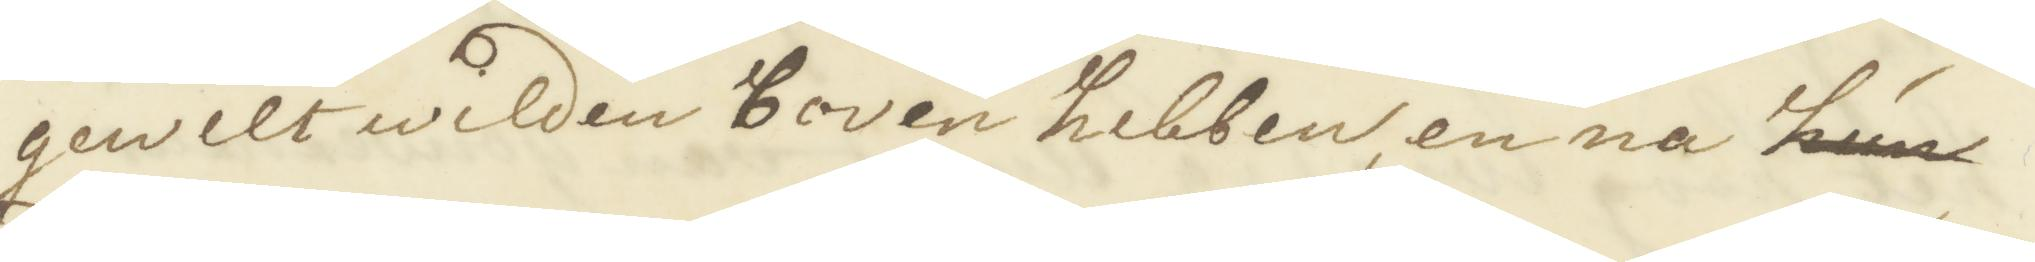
gewelt wilden boven hebben, en na hun
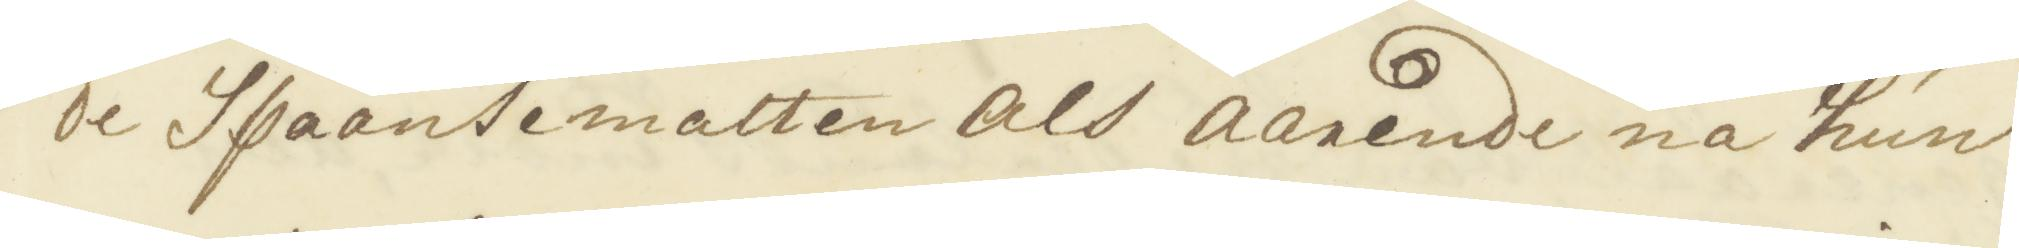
de Spaanse matten als aarende na hun
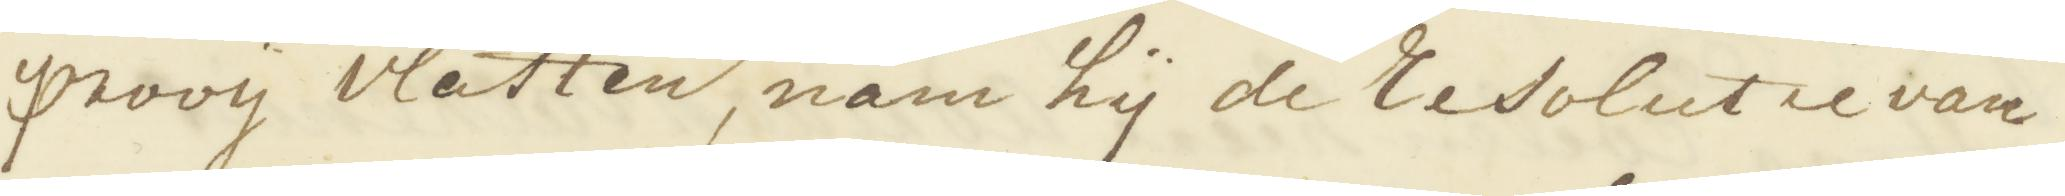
prooij vlasten, nam hij de resolutie van
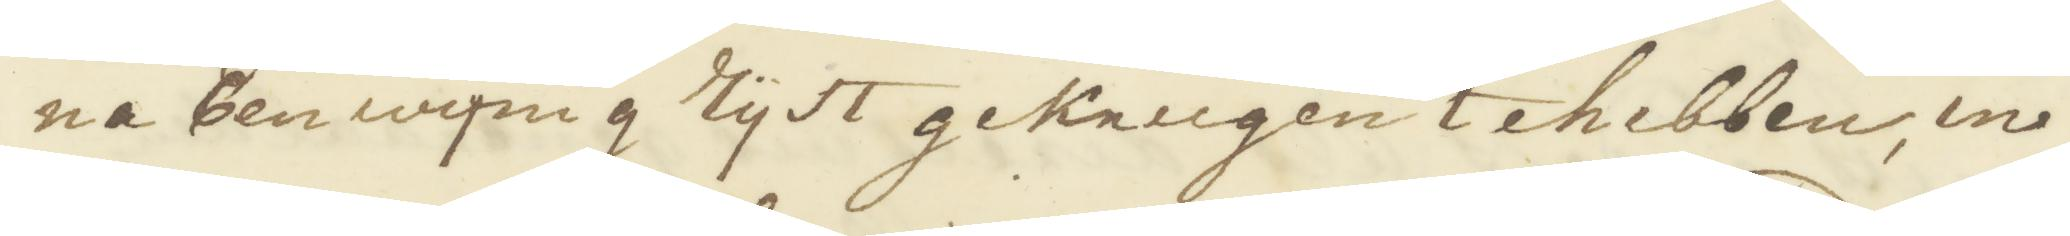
na Een wijnig rijst gekreegen te hebben, in
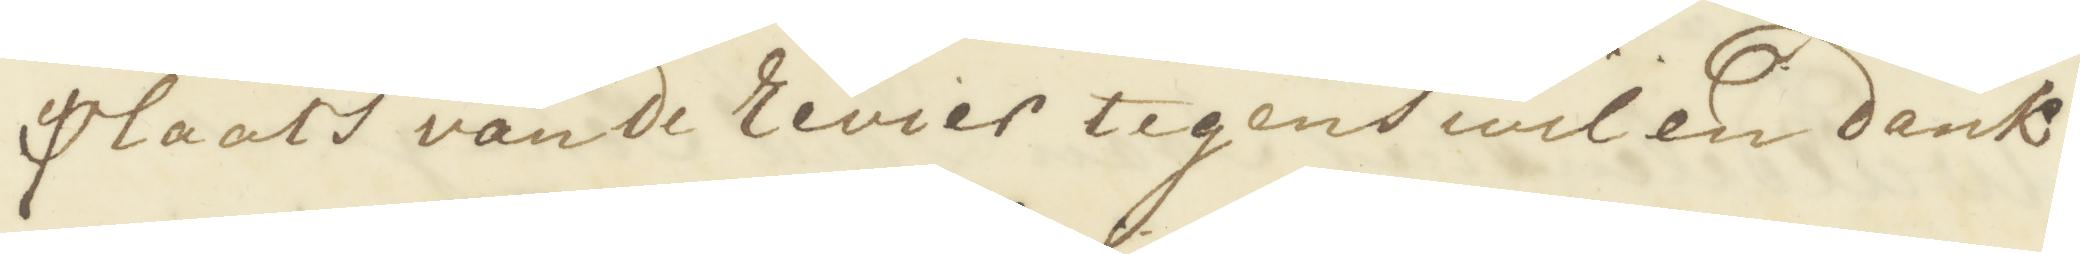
plaats van de revier tegens wil en dank
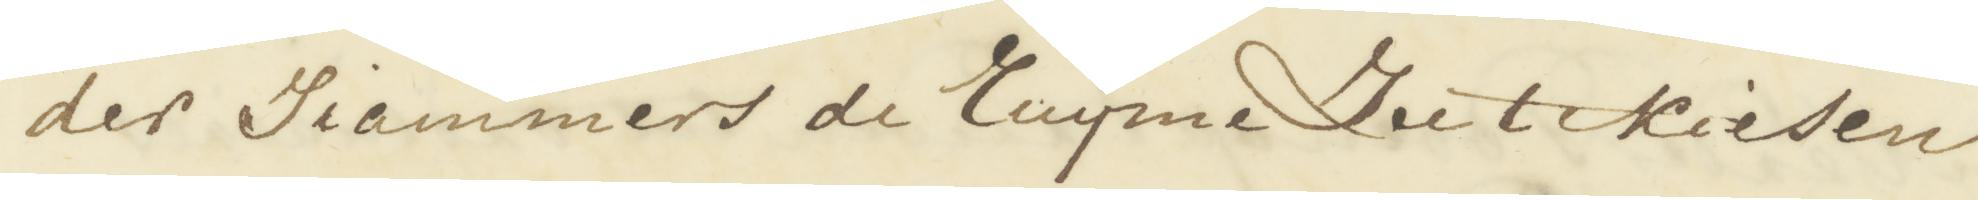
der Siammers de ruijme Zee te kiesen
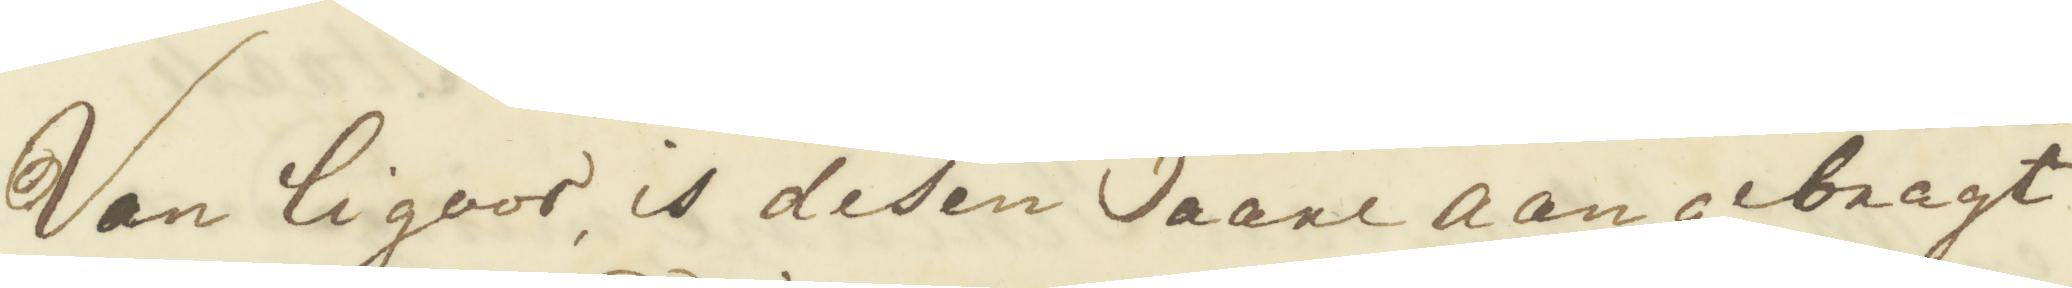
Van ligoor, is desen Iaare aangebragt
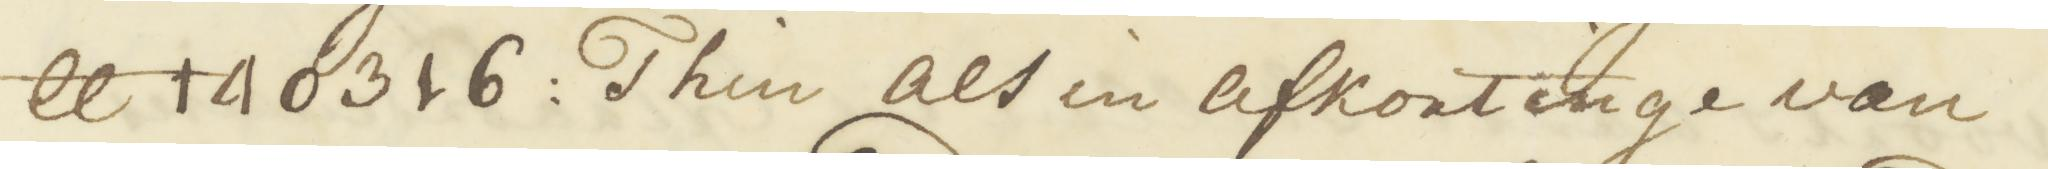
lb 140316: Thin als in afkortinge van
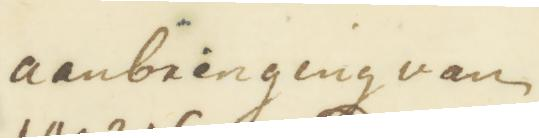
aanbrenging van
